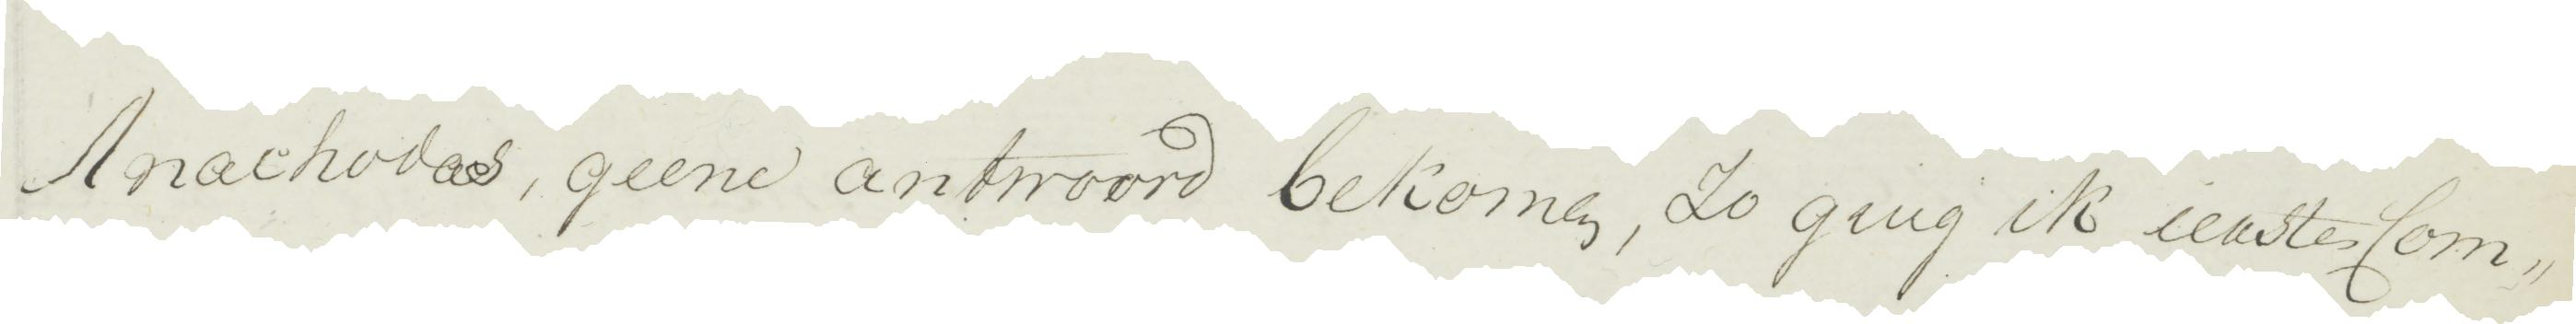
Anachodas, geene antwoord bekomen, zo ging ik eersten Com„
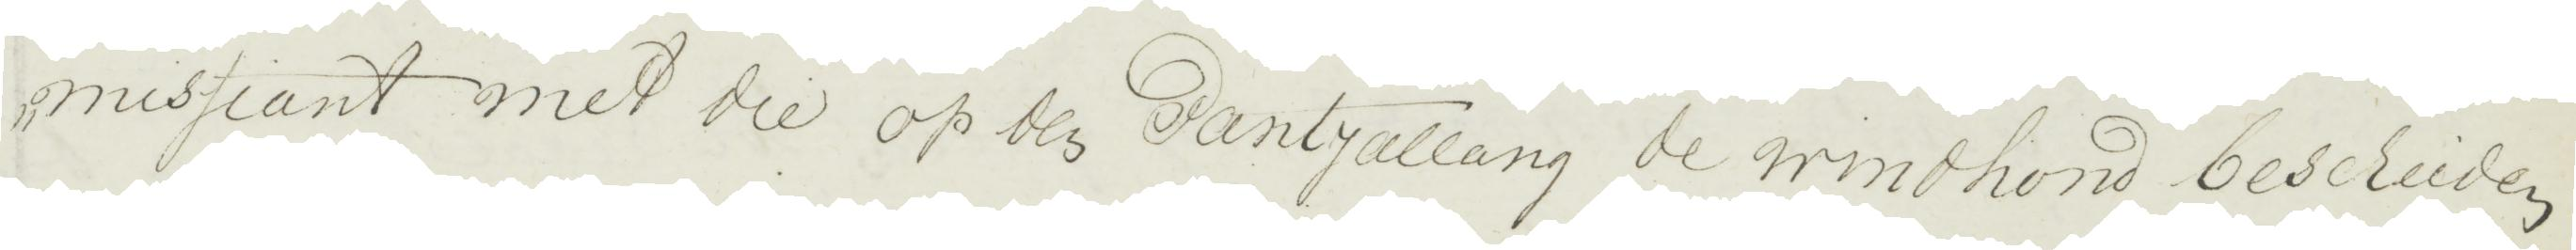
„missiant met die op den Pantjallang de windhond bescheiden
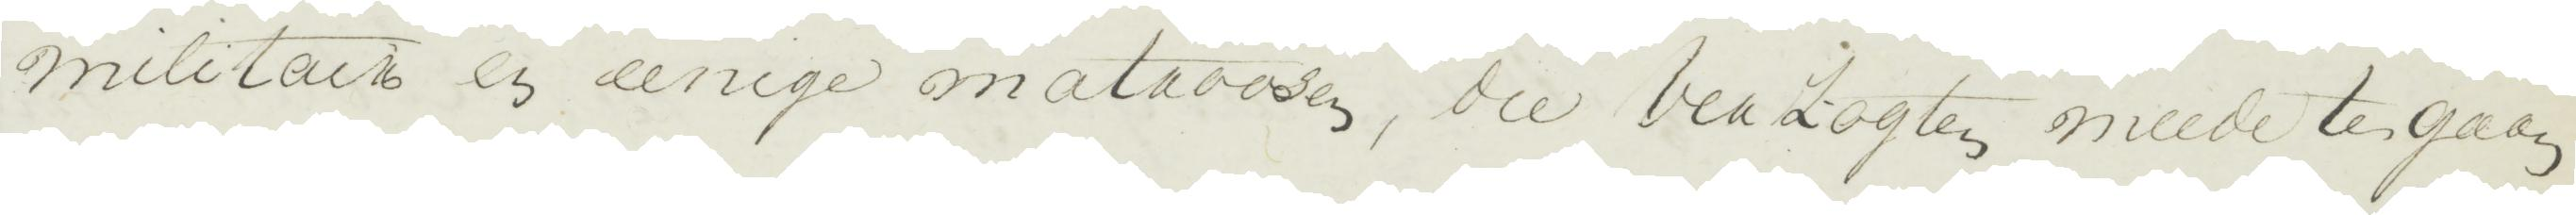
militair en eenige matroosen, die verzogten meede te gaan
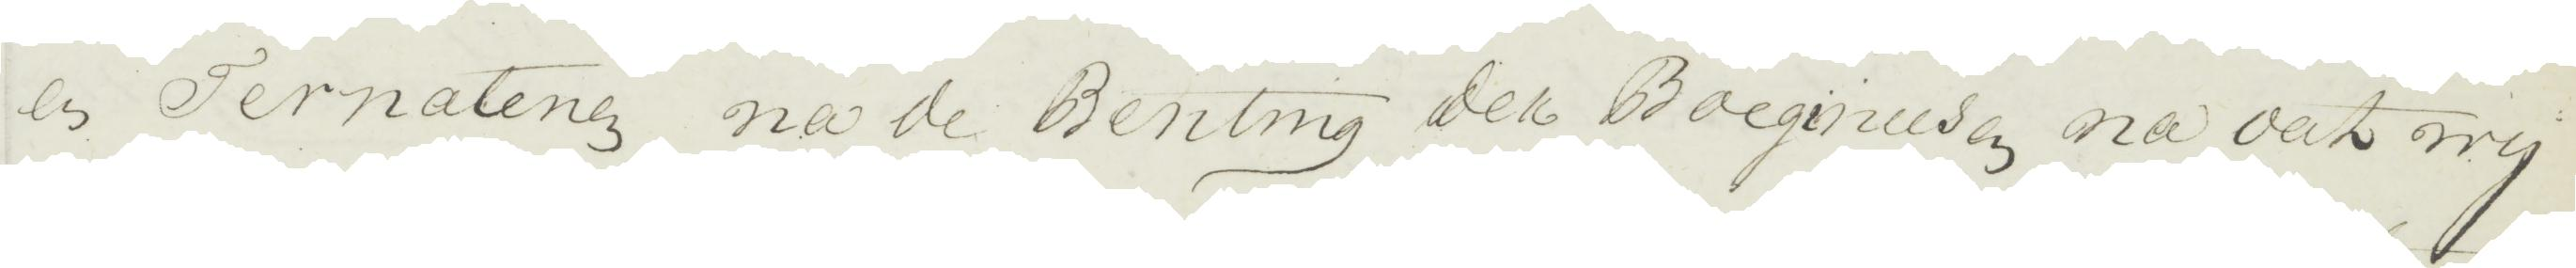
en Ternatenen na de Benting der Boegineesen na dat wy
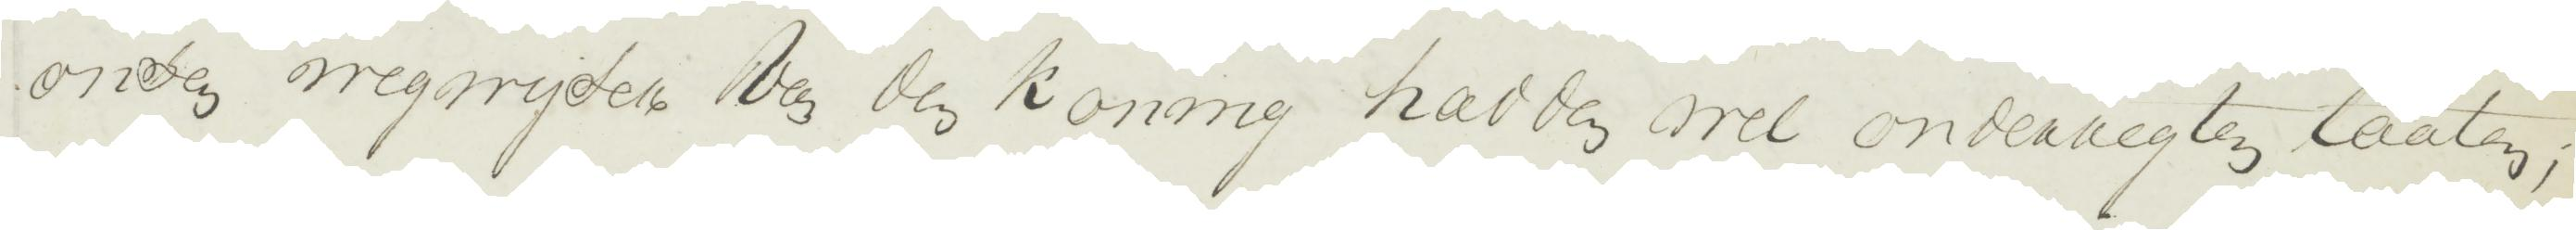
onsen wegwijser van den koning hadden wel onderregten laaten;
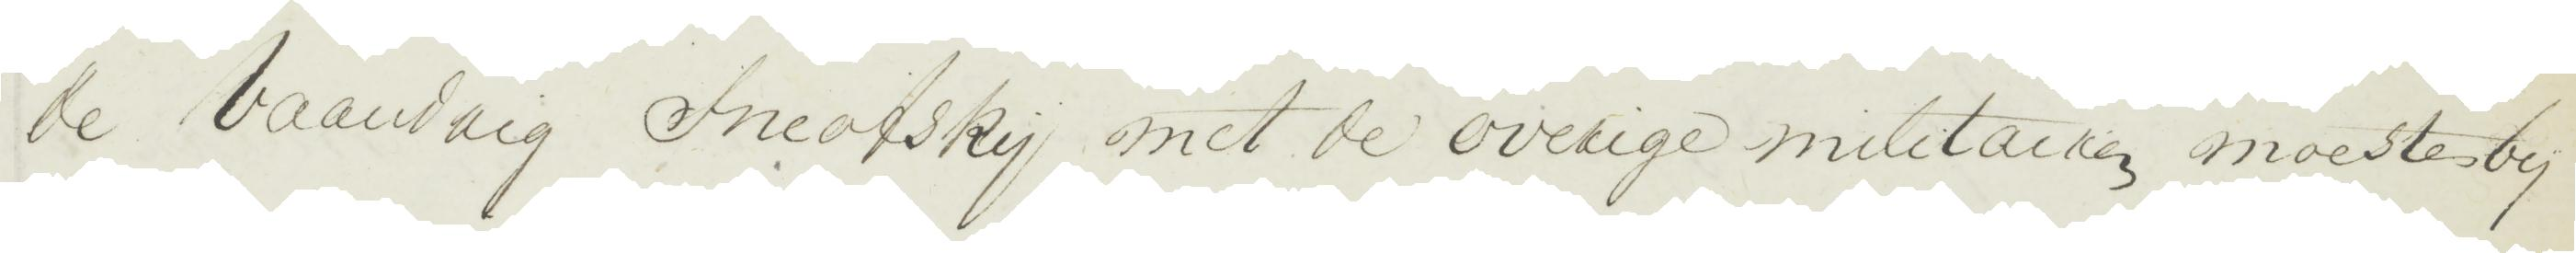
de vaandrig sneofskij met de overige militairen moeste bij
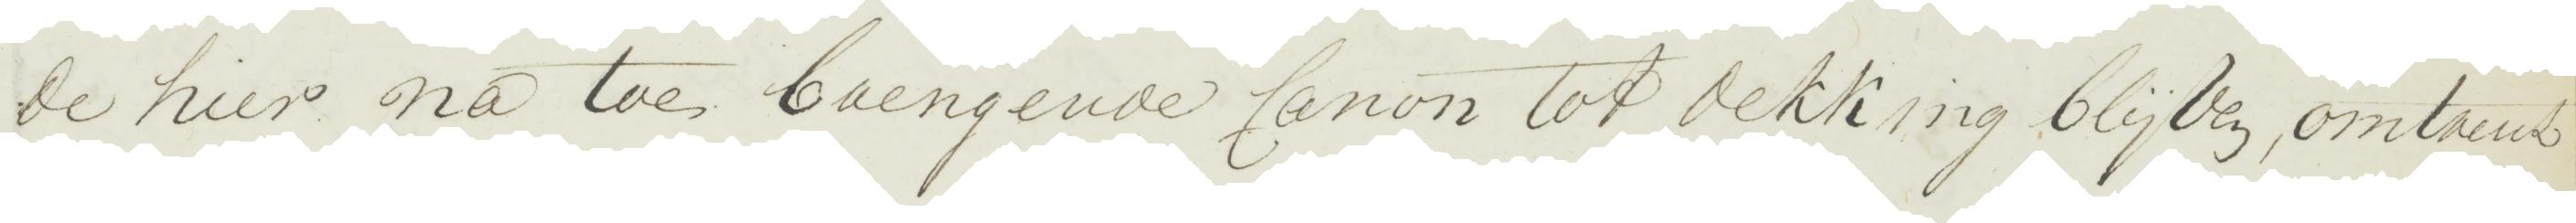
de hier na toe brengende Canon tot dekking blijven, omtrent
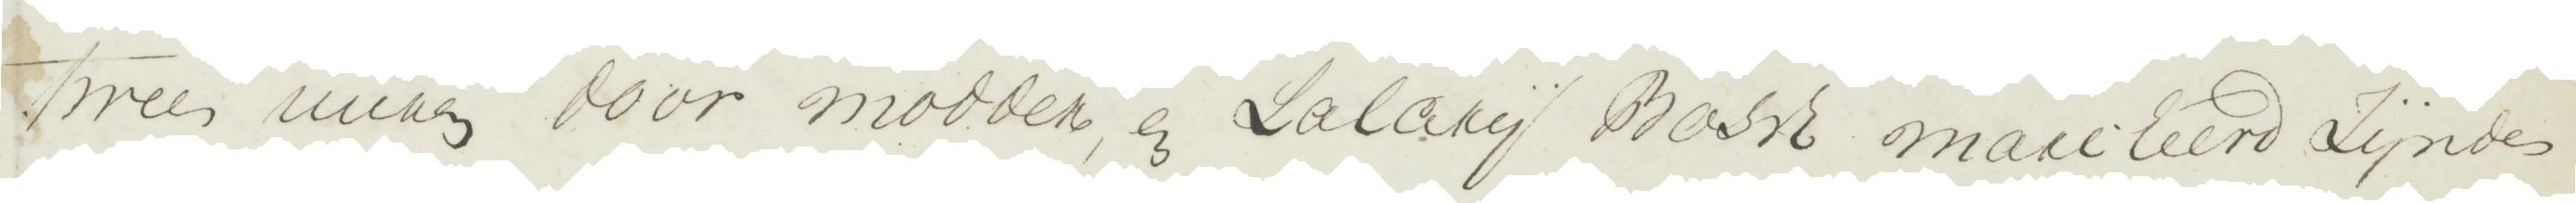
twee uuren door modder, en Lalarij Bosch marcheerd zijnde
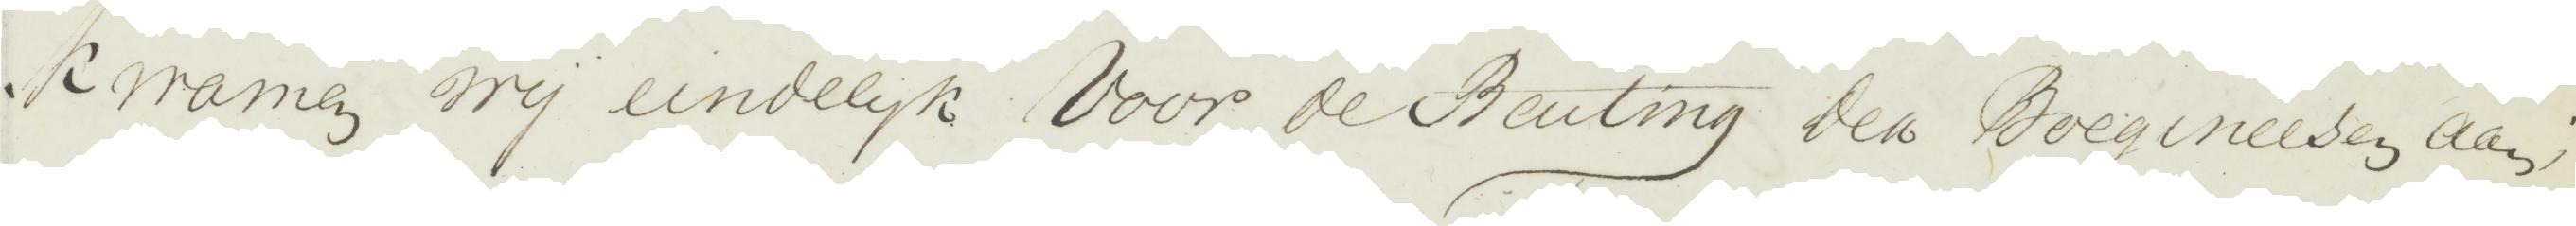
kwamen wij eindelijk voor de Benting der Boegineesen aan,
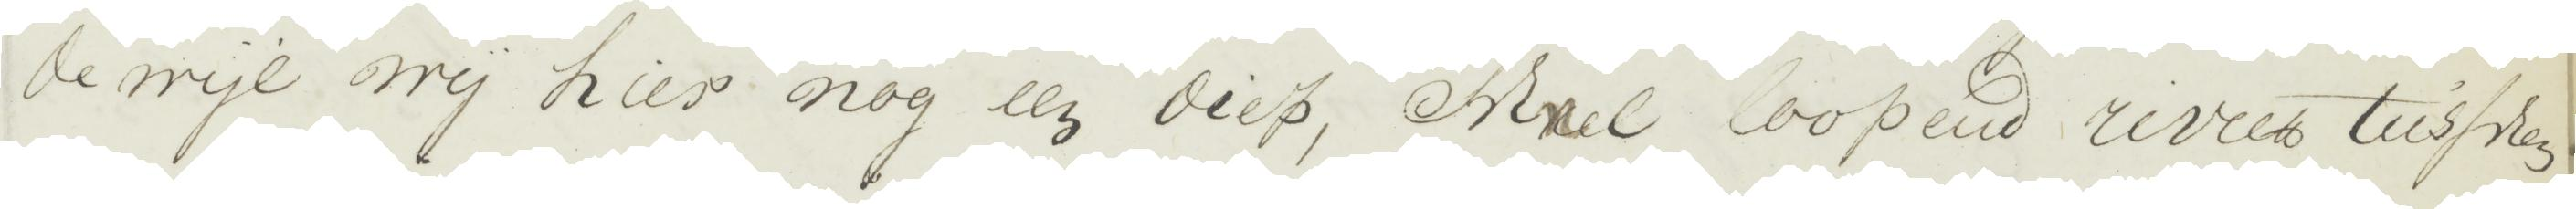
de wijl wij hier nog een diep, schnel loopend riveer tusschen
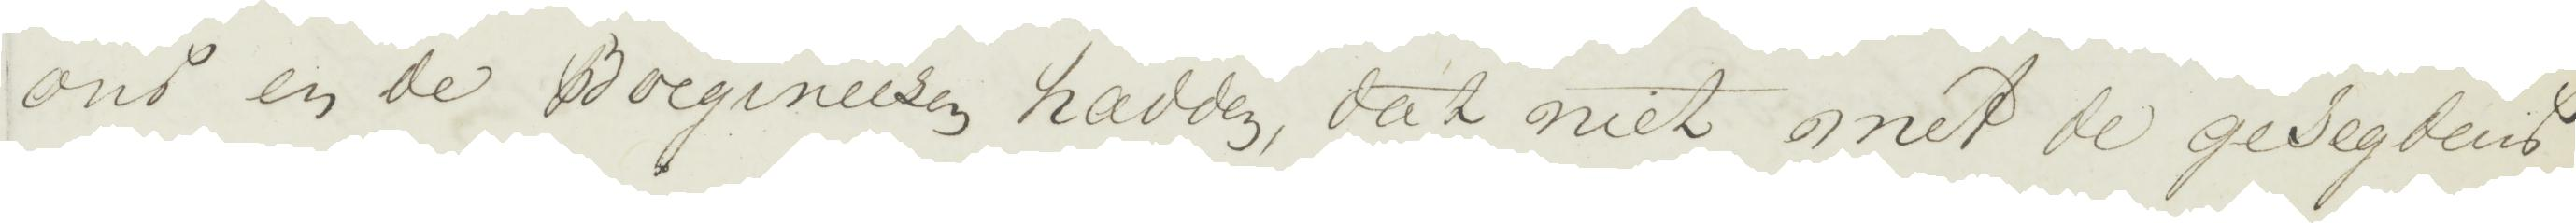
ons en de Boegineesen hadden, dat niet met de gesegdens
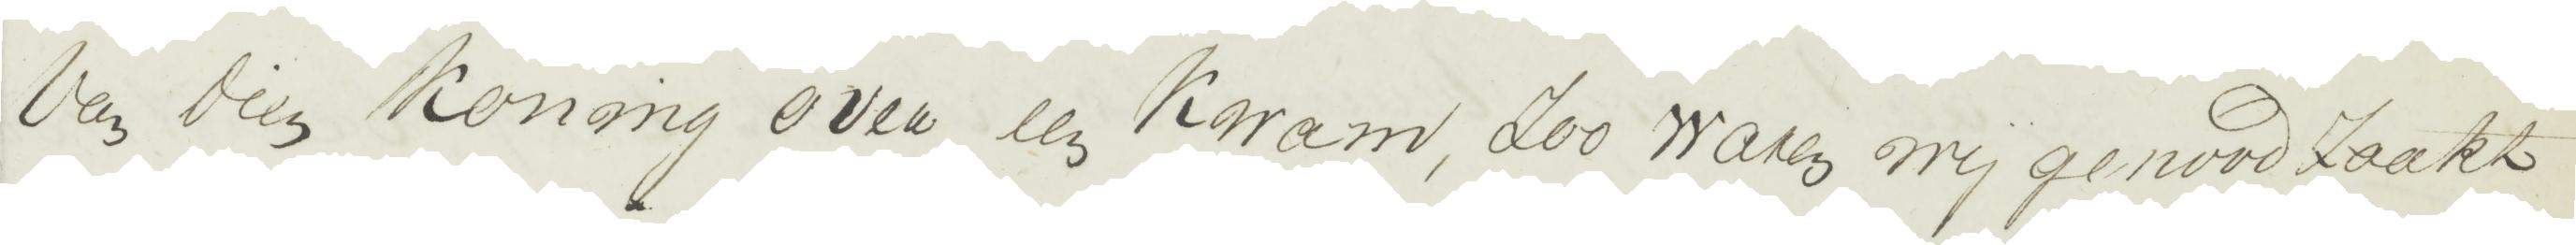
van dien koning over een kwam, zoo waren wij genoodzaakt
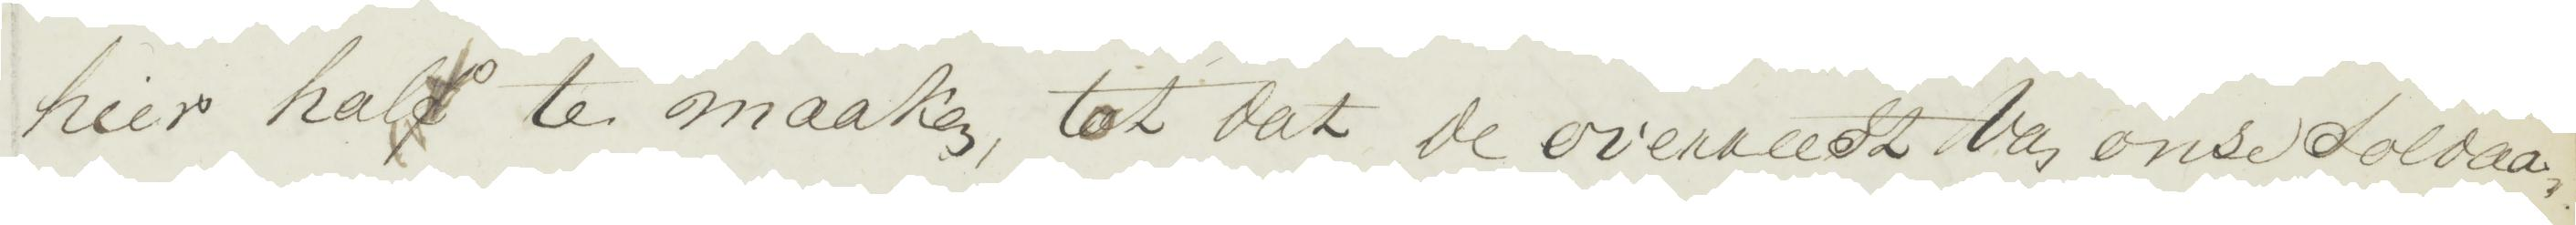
hier halt te maaken, tot dat de overreest van onse soldaa„
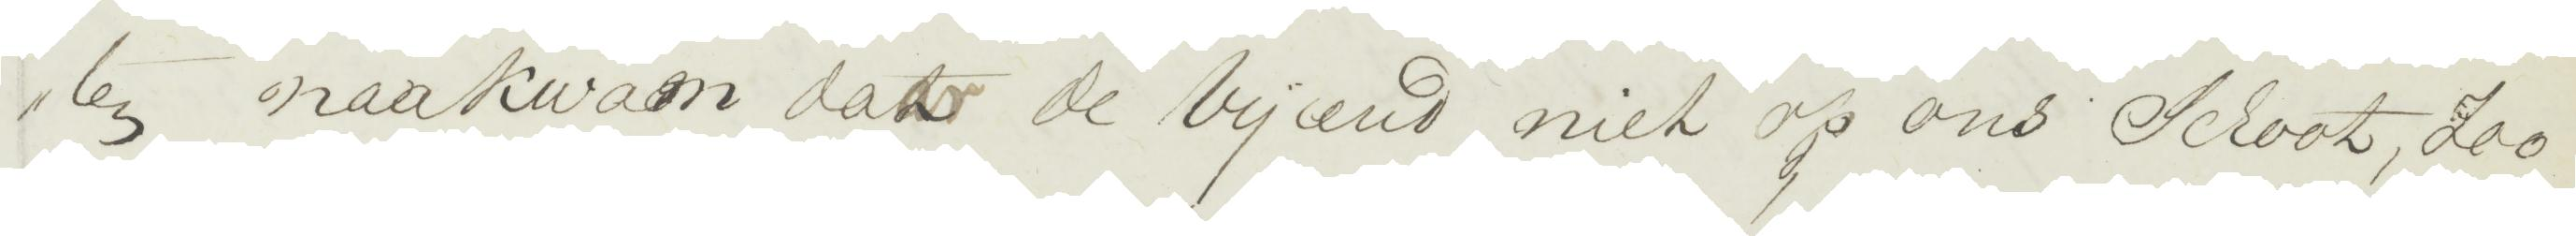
„ten naakwam daar de vijand niet op ons schoot, zoo
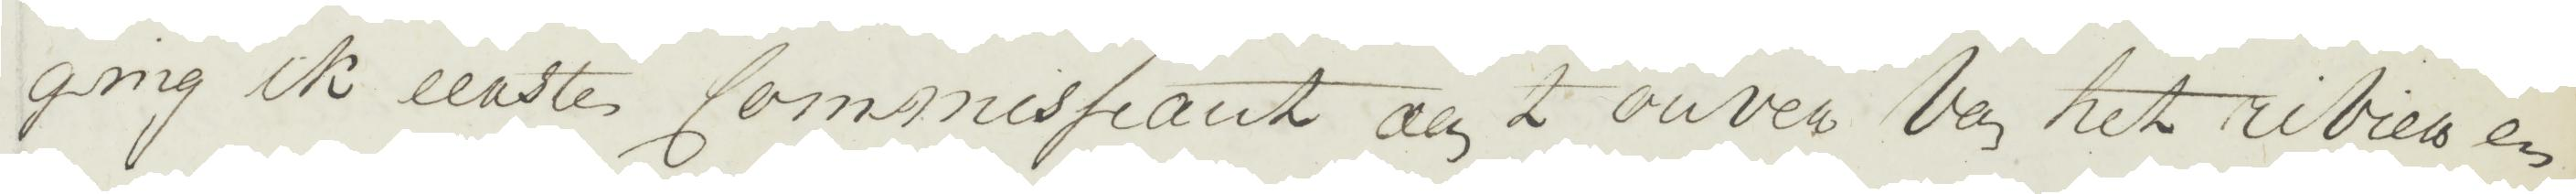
ging ik eerste Commissiant aan ’t ouver van het rivier en
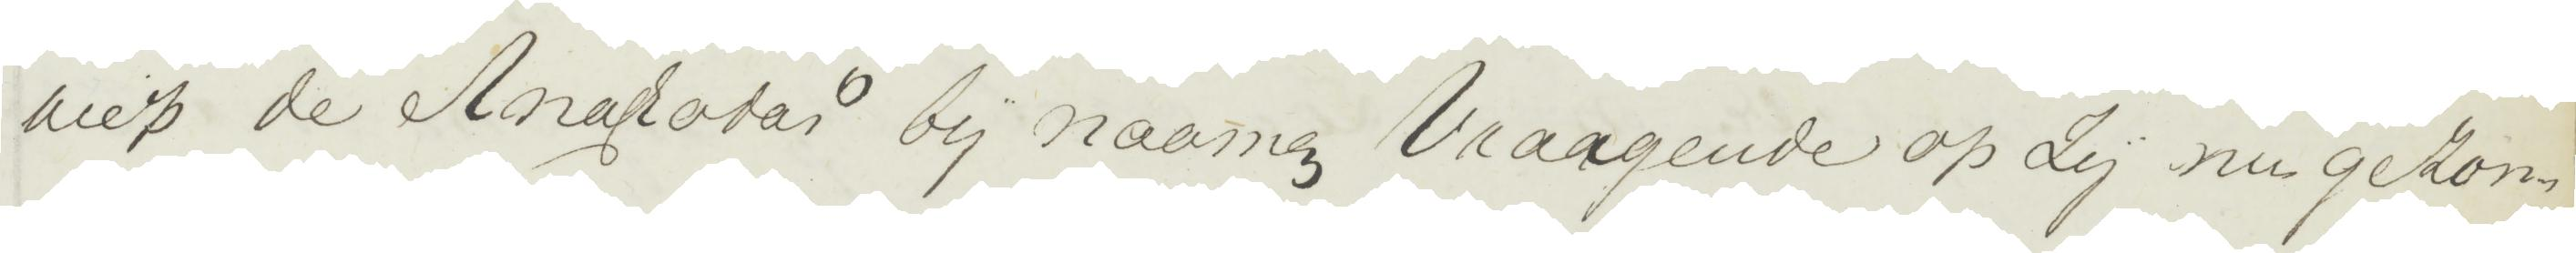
riep de Anachodas bij naamen vraagende op zij nu gezon„
